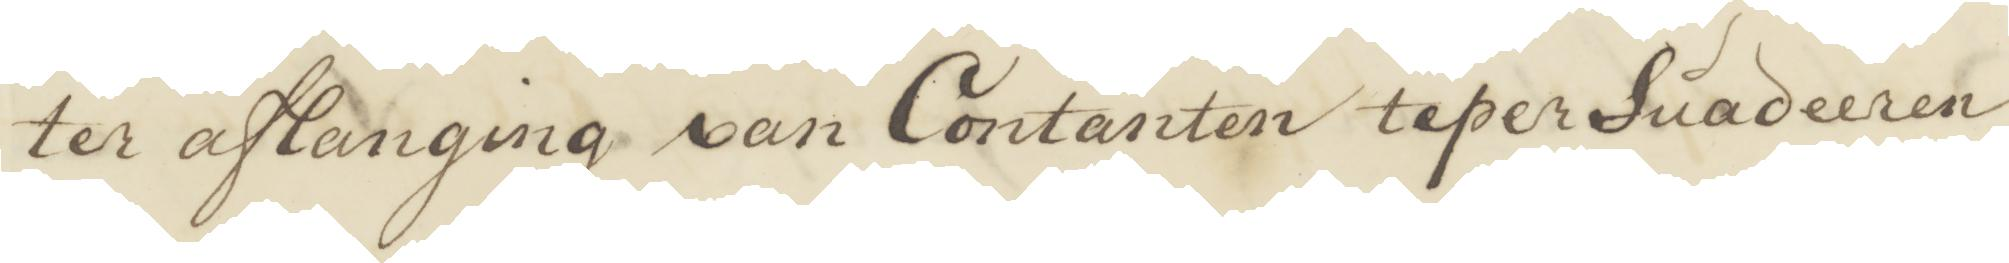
ter aflanging van Contanten te persuadeeren
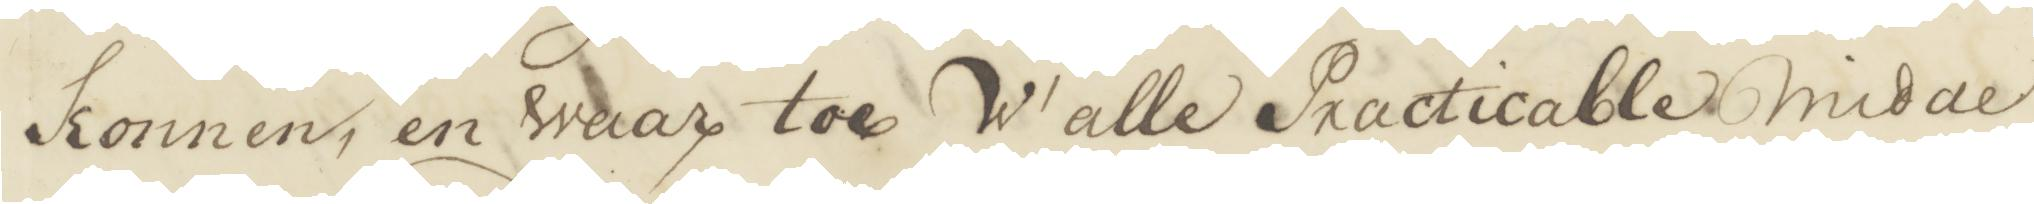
konnen, en waar toe w'alle Practicable midde
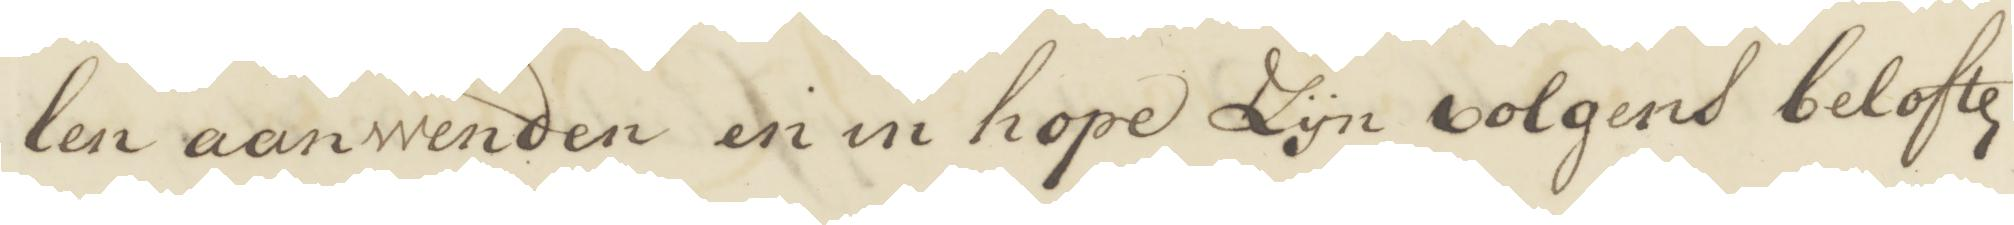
len aanwenden en in hope zijn volgens beloften
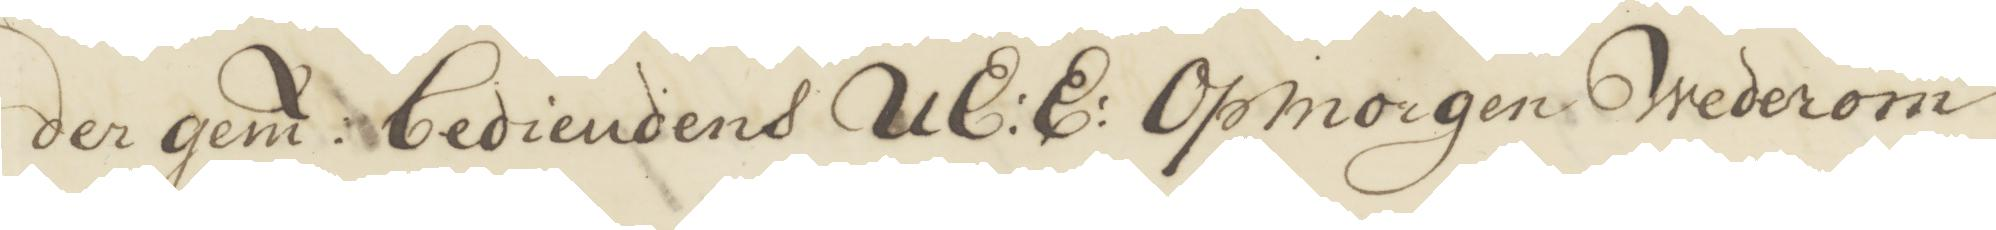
der gem: bediendens UE: E: Op morgen wederom
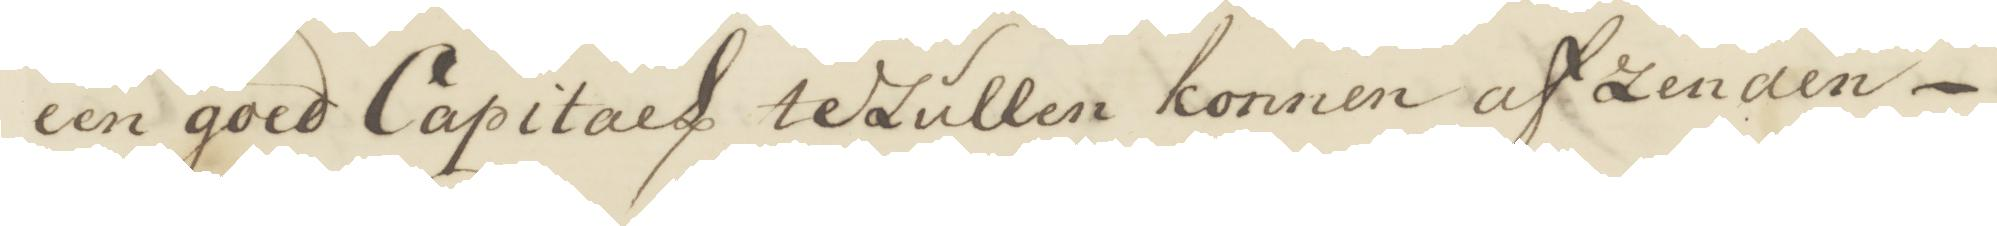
een goed Capitael te zullen konnen af zenden —
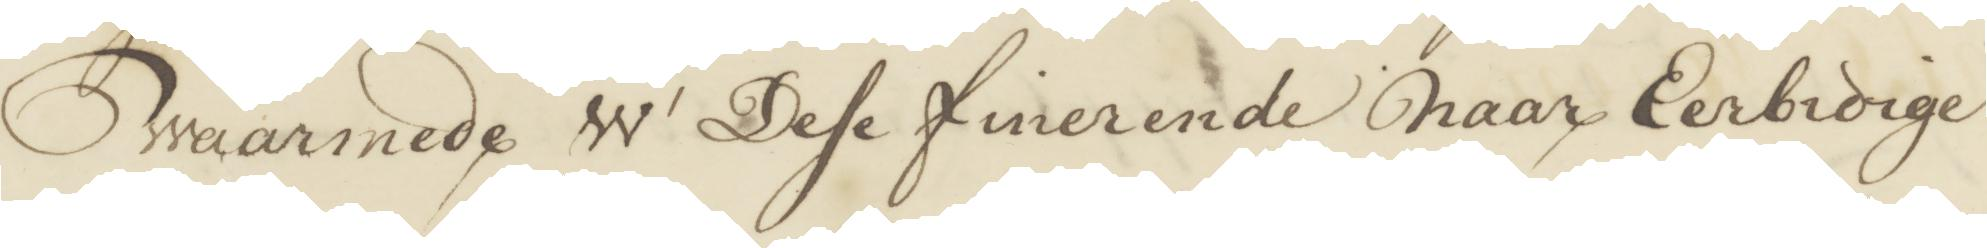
waarmede w' Dese finerende naar Eerbidige
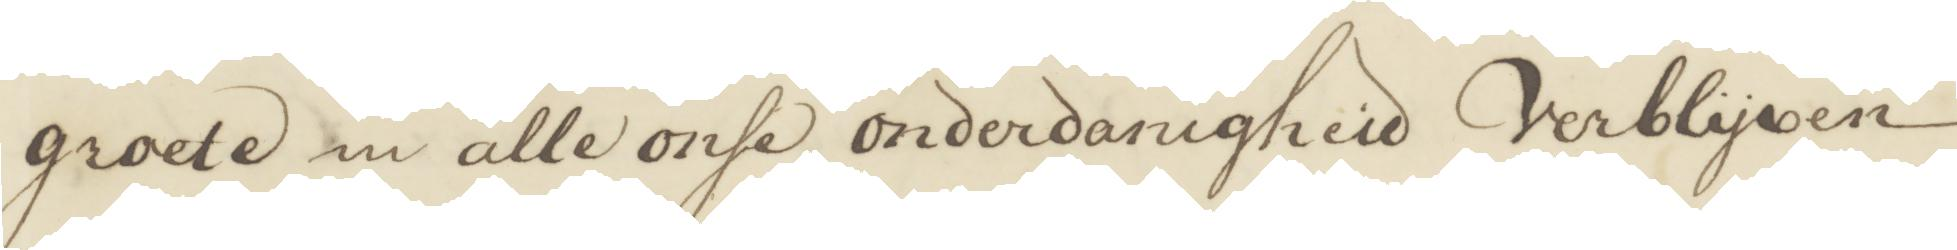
groete in alle onse onderdanigheid verblijven
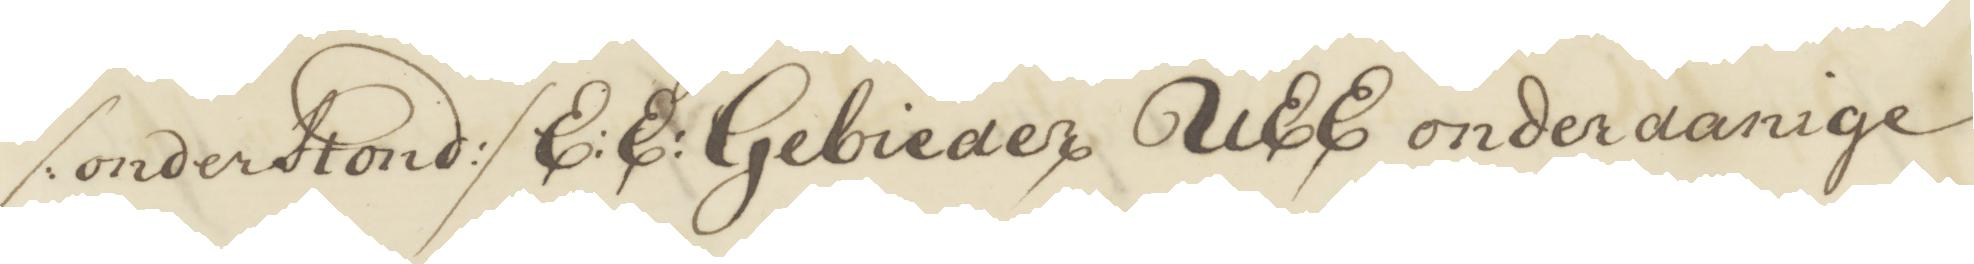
/:onderstond:/ E: E: Gebieder UEE onderdanige
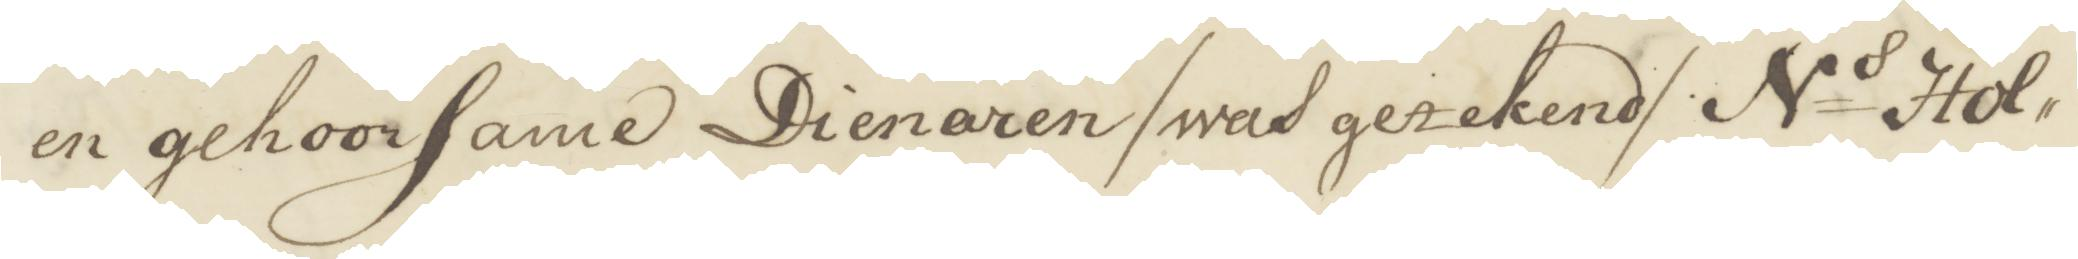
en gehoorsame Dienaren /was getekend/ N=s Hol„
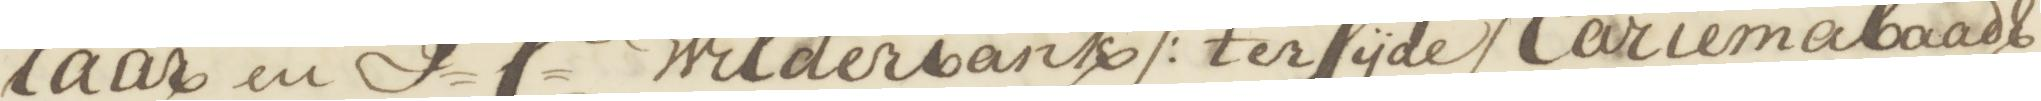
laar en J=n C Wildervank /:tersijde/ Cariemabaadh
